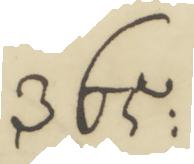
365:
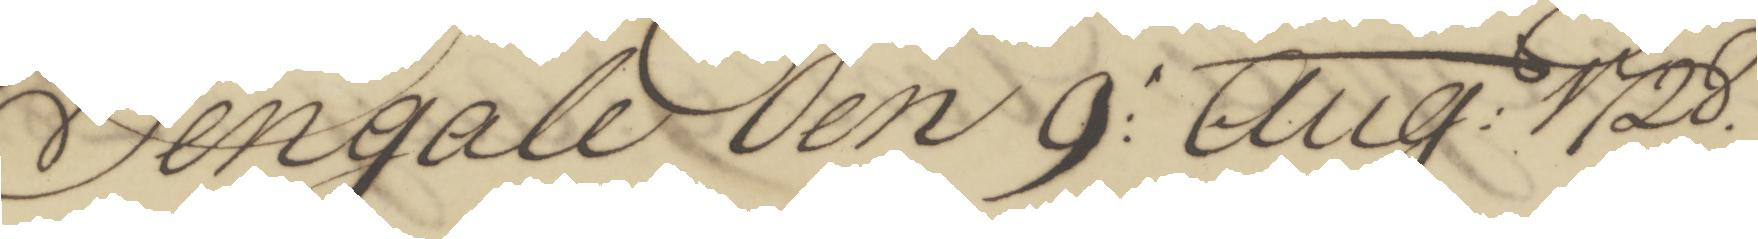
Bengale den 9:e aug:s 1728.
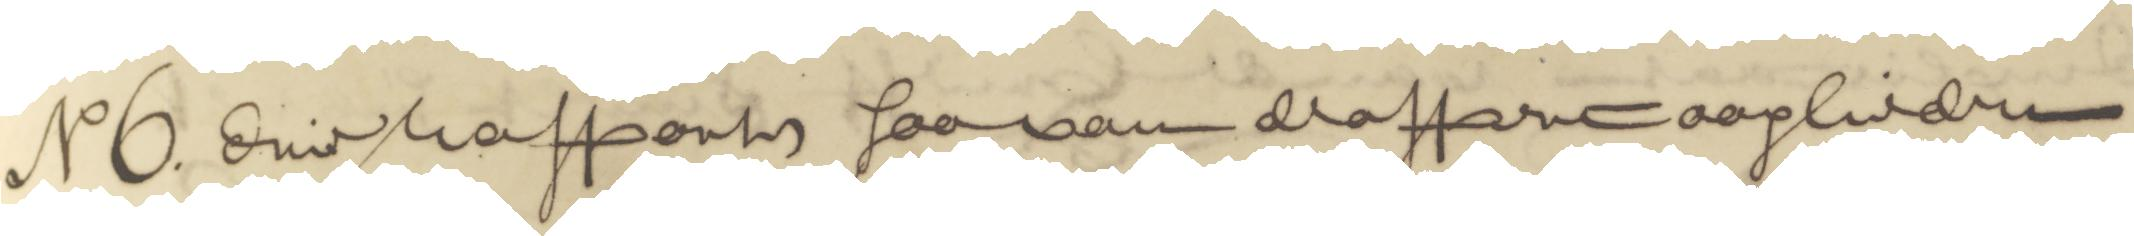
N6. die rapporten soo van de oppercooplieden
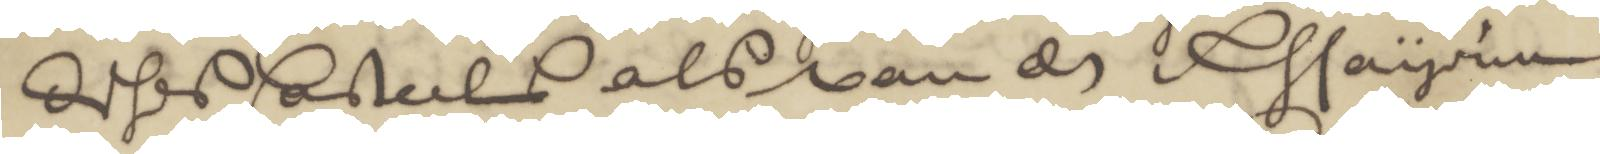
deses Casteels als van den Essaijeur
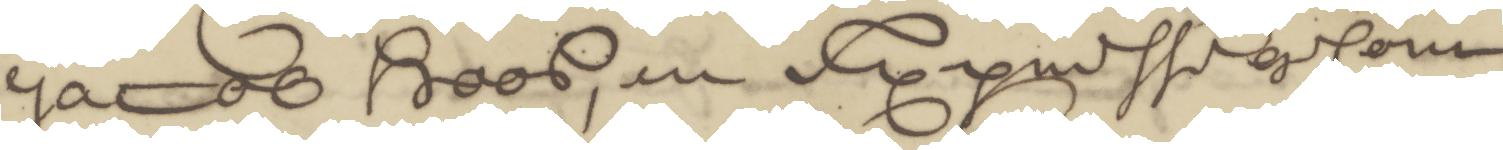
Jacob Hoos, en Expresse gecom
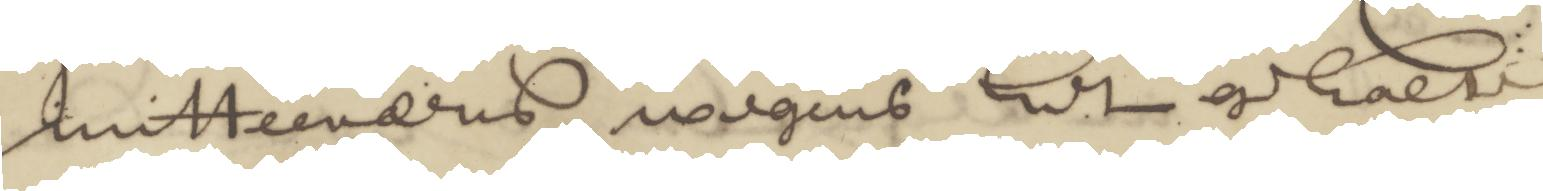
mitteerdens wegens het gehalte
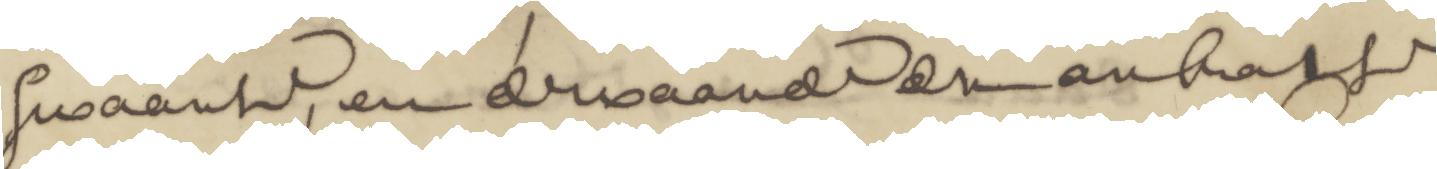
swaarte, en dewaarde der arkatse
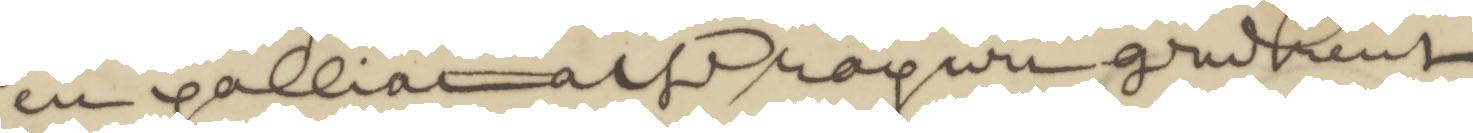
en palliacatse ropien gerekent
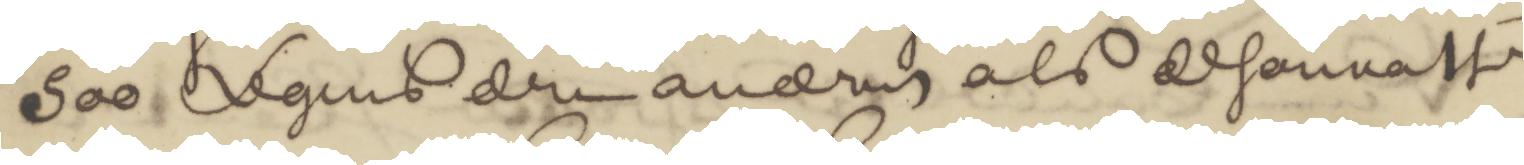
soo tegens den anderen als desouratse
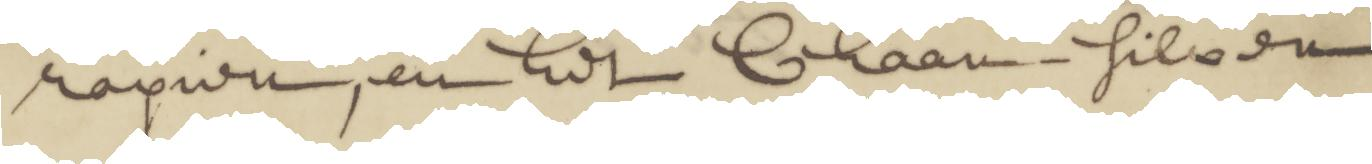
ropien, en het Bhaar-silver
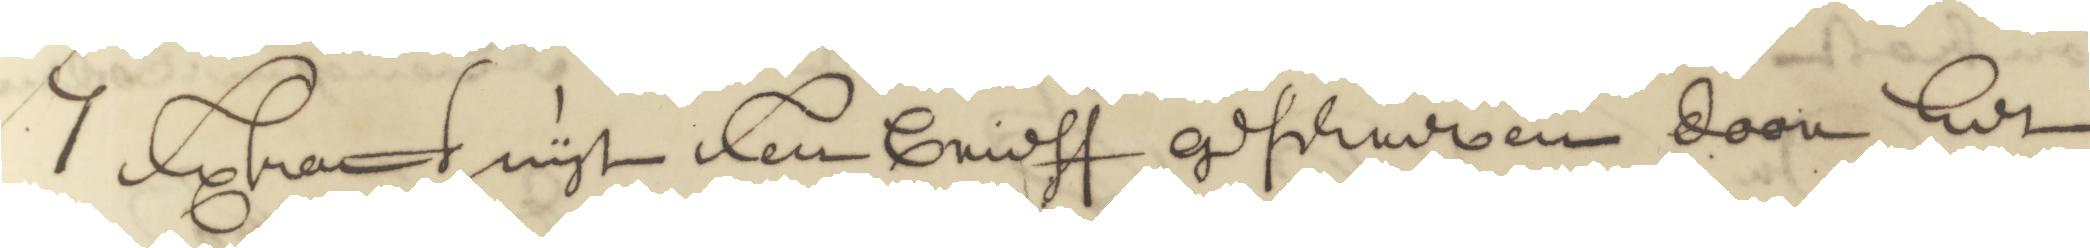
7 extract uijt Een brieff geschreven door het
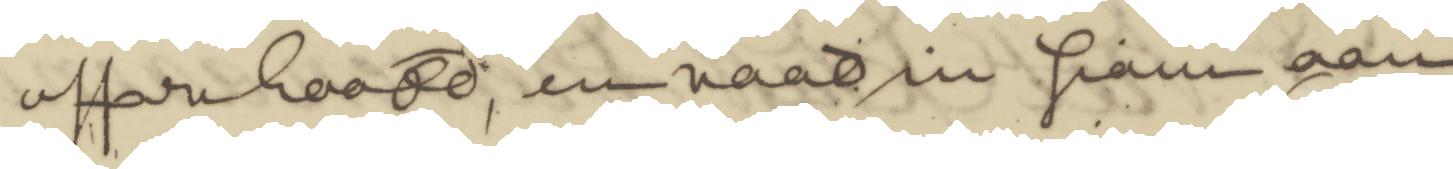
opperhoofd, en raad in siam aan
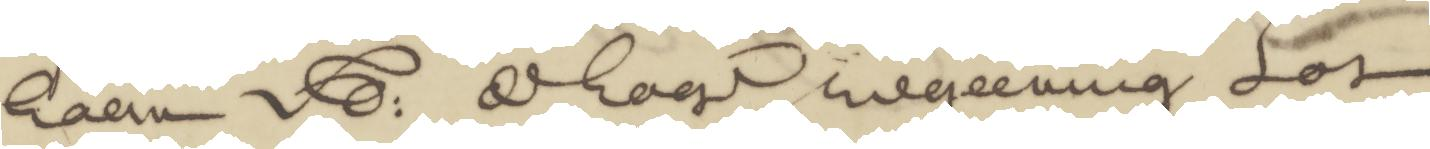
haer Ed: de hoge regeering tot
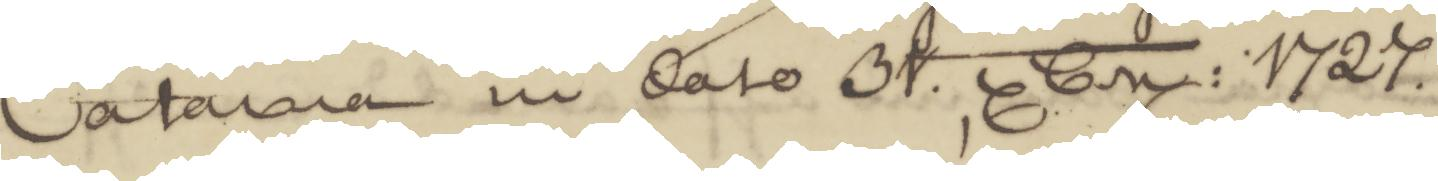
Batavia in dato 31. xbr: 1727.
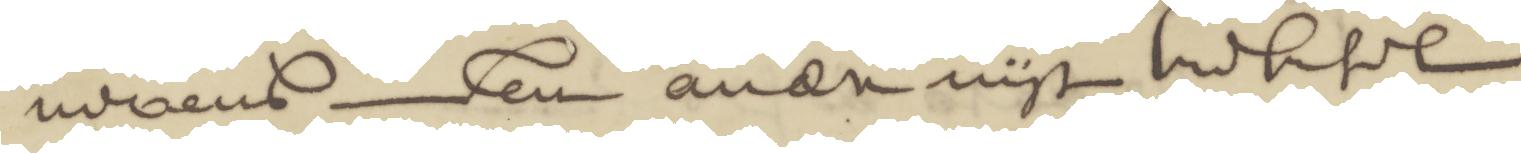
nevens een andr uijt treksel
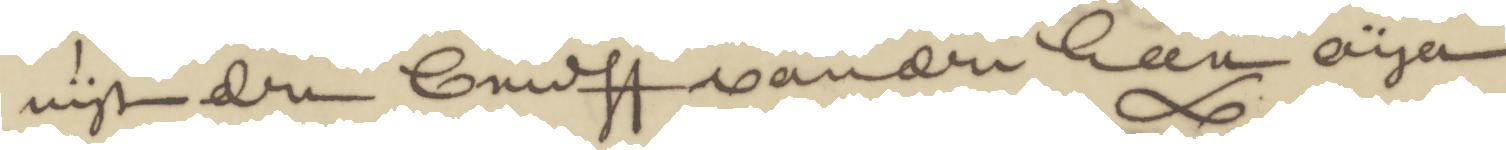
uijt den brieff van den heer aija
